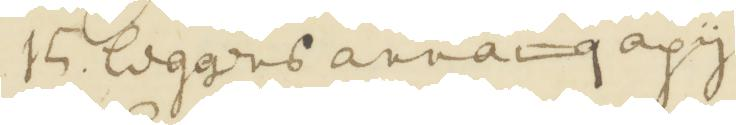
15. leggers arracq apij
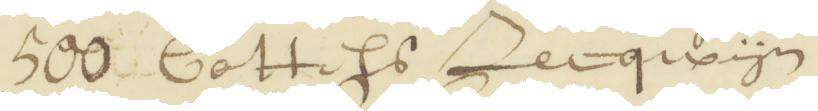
500 bottels Lecqwijn
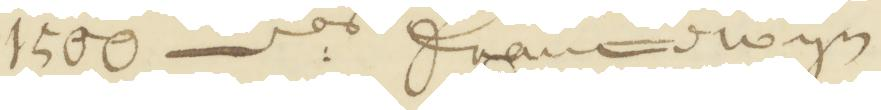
1500 _:os france wijn
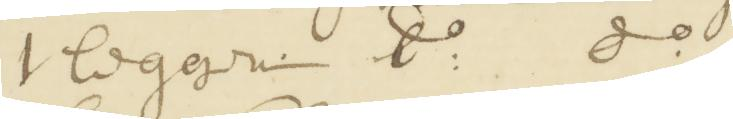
1 legger d:o d:o
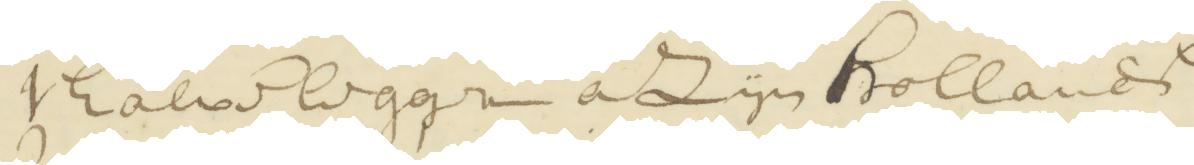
1 halve legger azijn hollands
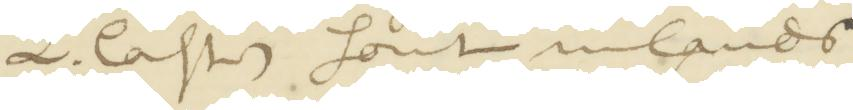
2. lasten hout inlands
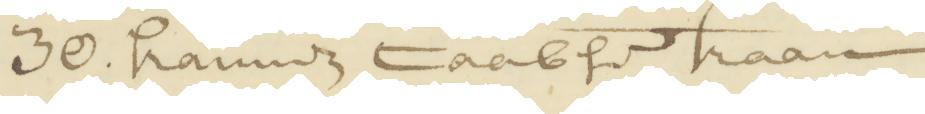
30. kannen caabse traan
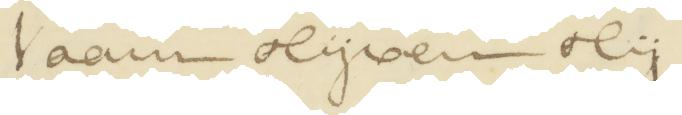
1 aam olijven olij
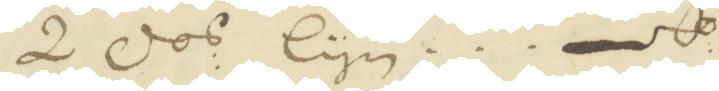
2 D:os lijn - - - d:o
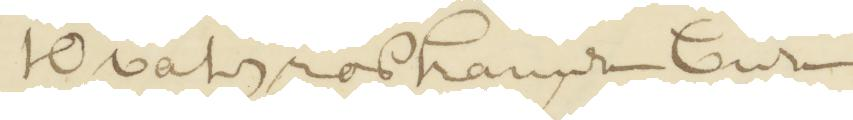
10 vaten roskanner bier
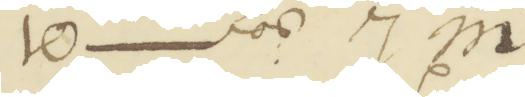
10 _:os J M
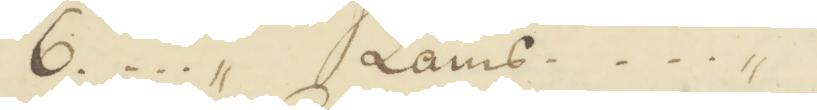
6. ... „ Lams ... „
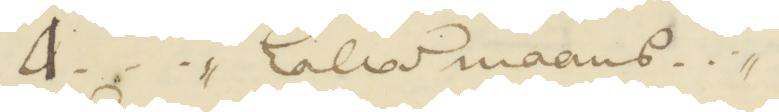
4 ... „ halve maans ... „
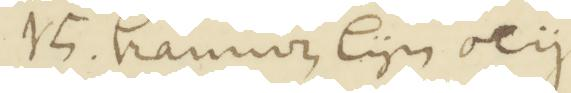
15. kannen lijn olij
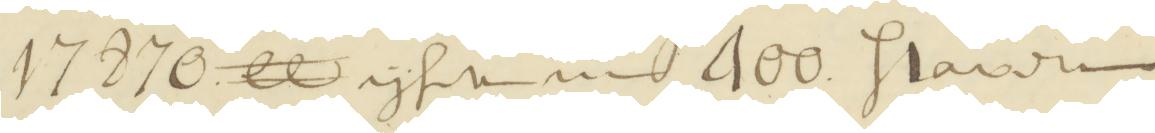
17870. ll ijser in 400. staven
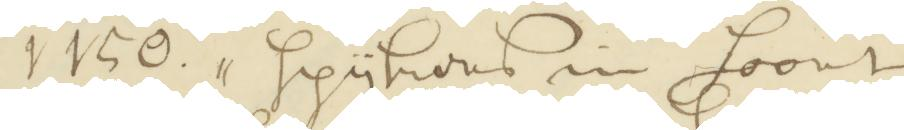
1150. „ spijkers in Soort
